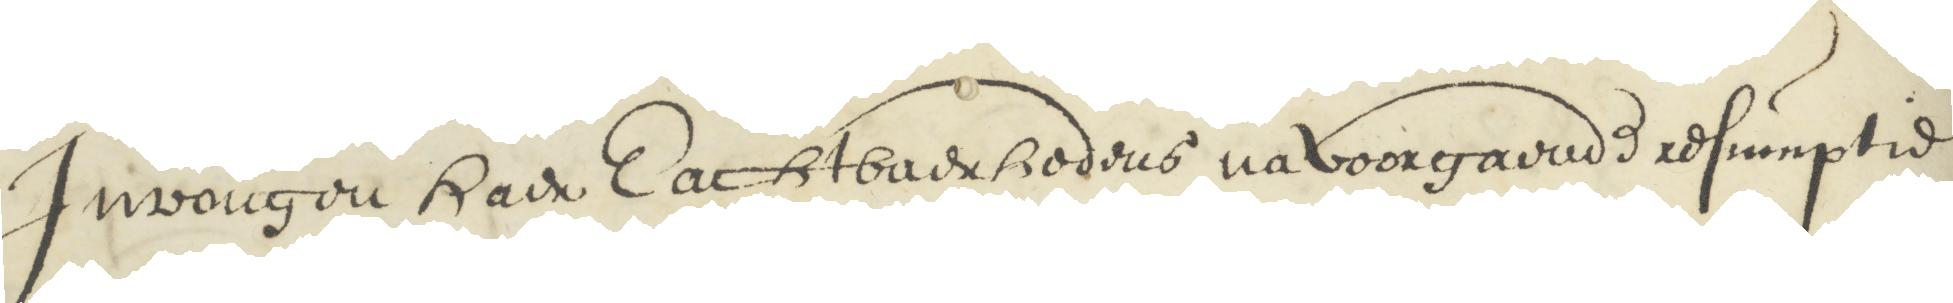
Jnvougen haer E achtbaerhedens na voorgaende resumptie
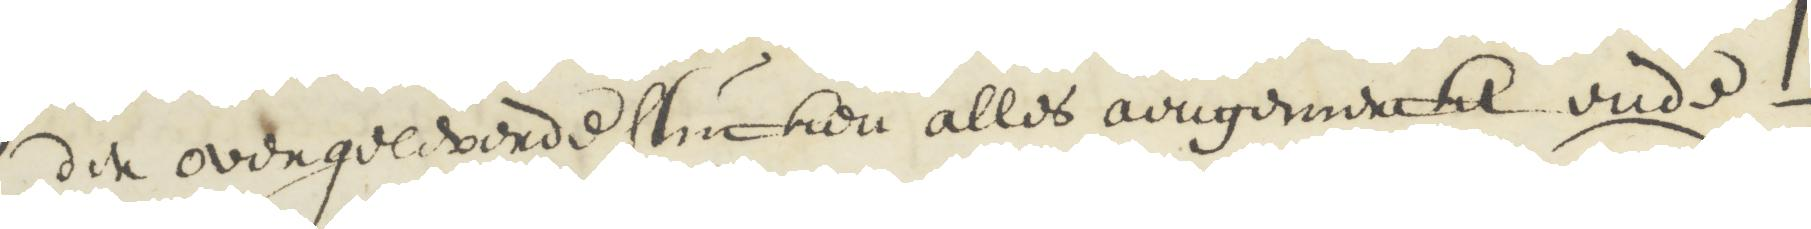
der overgeleverde stucken alles aengemerckt ende —
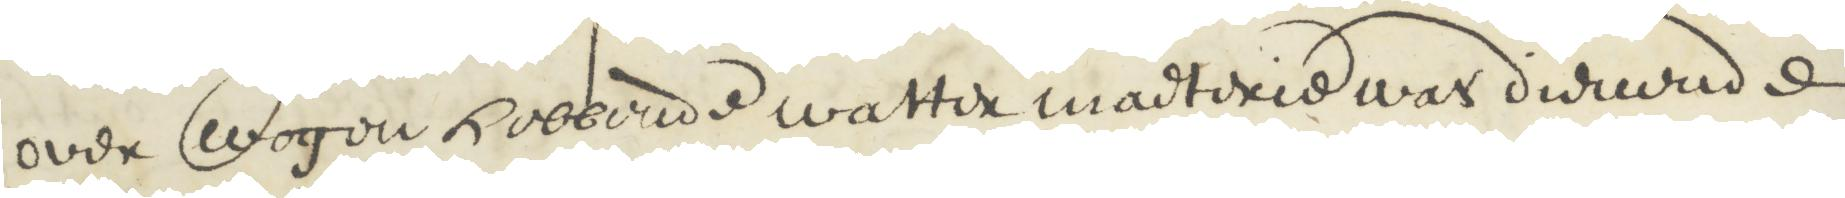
over wogen hebbende watter maeterie was dienende
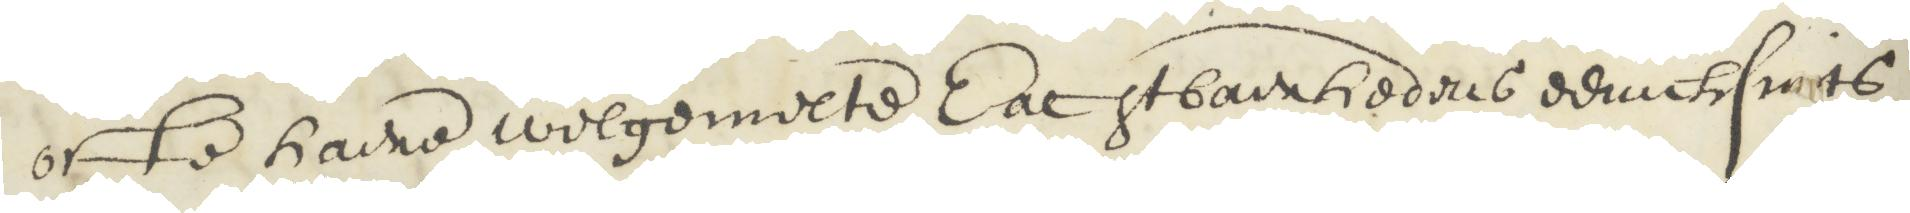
ofte haere welgemelte E achtbaerhedens eenichsints
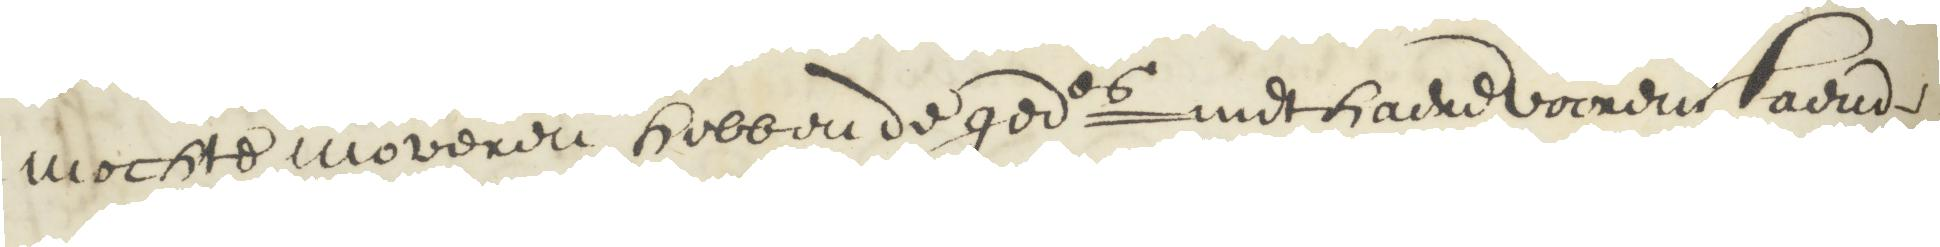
mochte moveren hebben de ged=es met haere voorenstaende
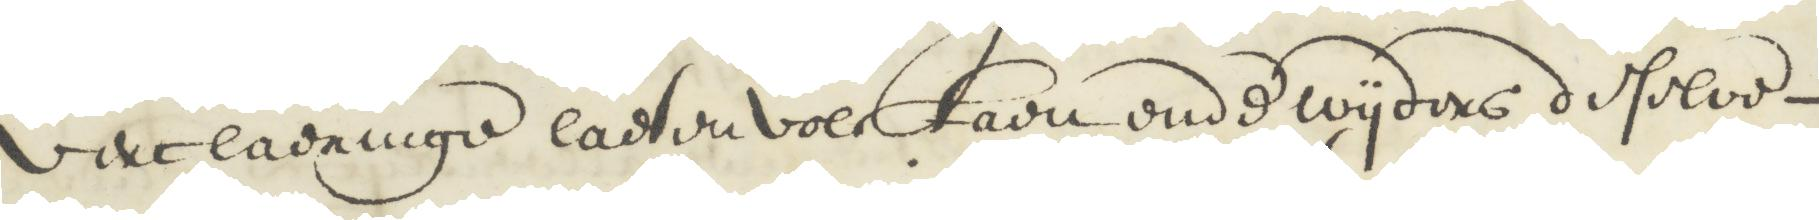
verclaeringe laeten volstaen ende wijders deselve —
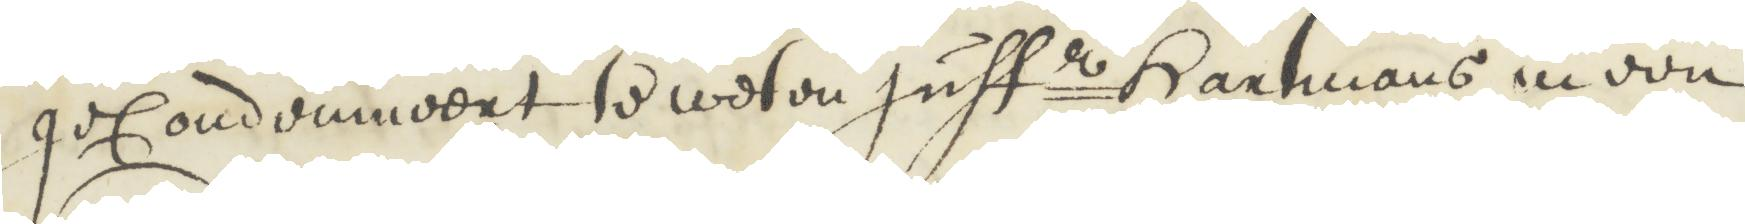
gecondemneert te weten juff=r hartmans in een
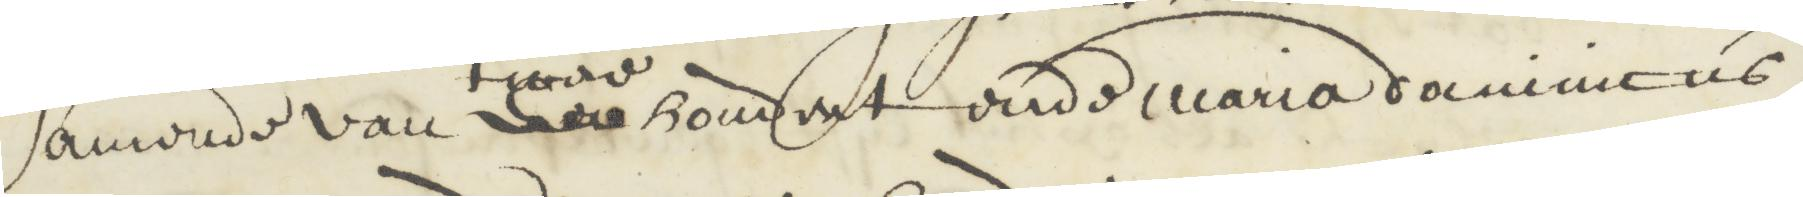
amende van vr hondert ende maria dominicus
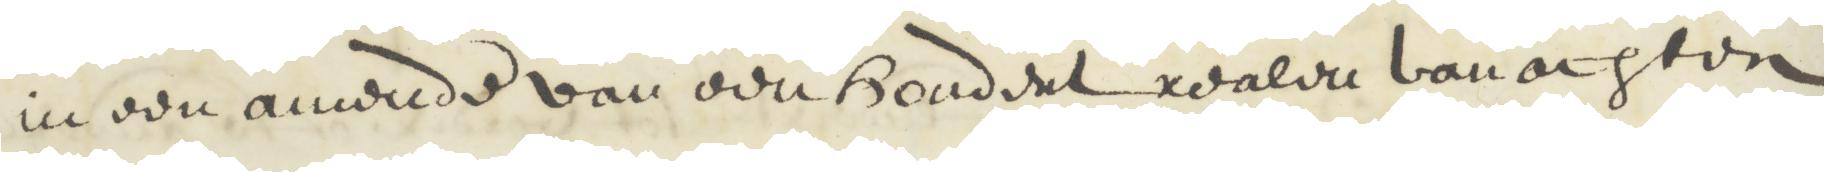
in een amende van een hondert realen van achter
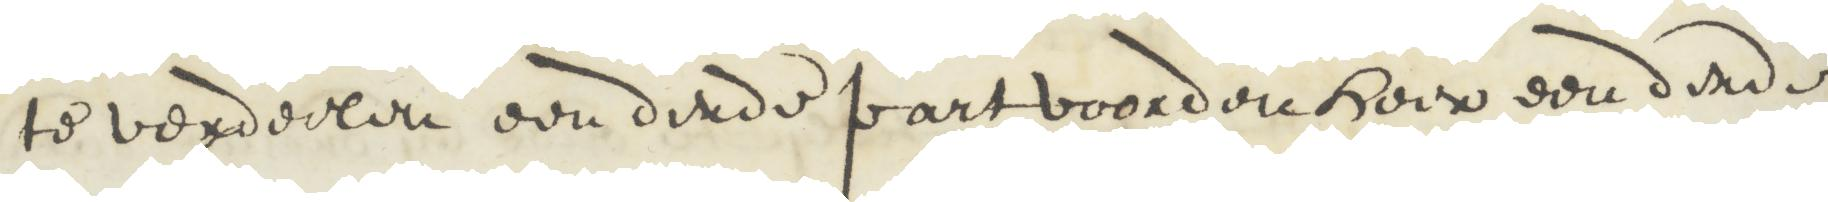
te verdeelen een derde part voor den heer een derde
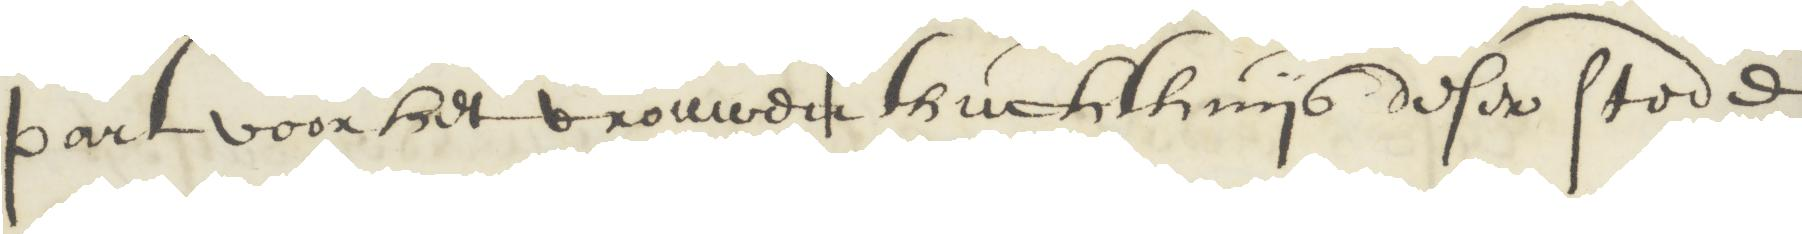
part voor het vrouwen thuchthuijs deser stede
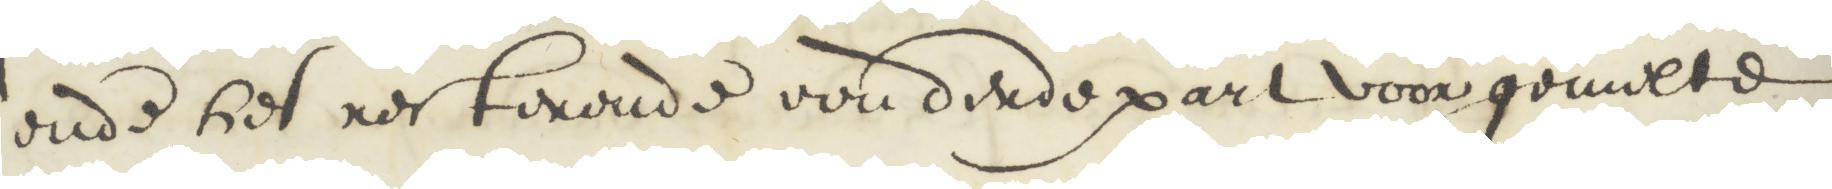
ende het resterende een derde part voor gemelte
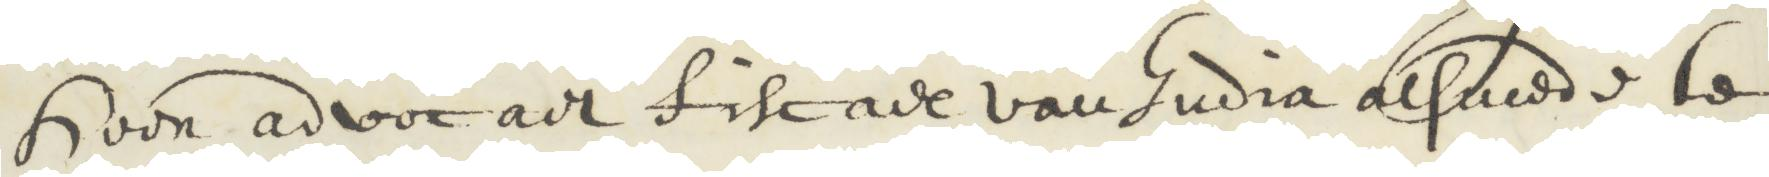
heer advocaet fiscael van India alsmede te
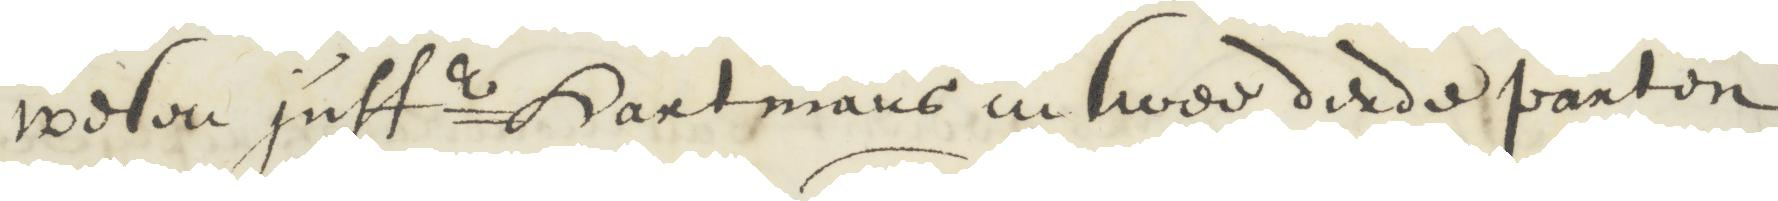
weten juff=r hartmans in twee derde parten
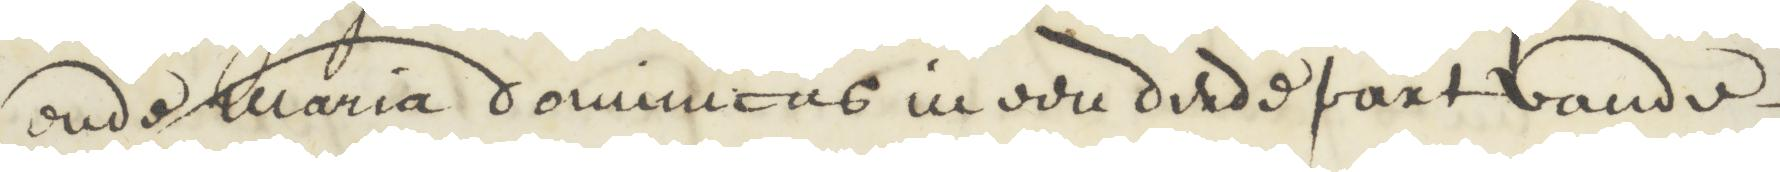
ende maria dominicus in een derde part vande
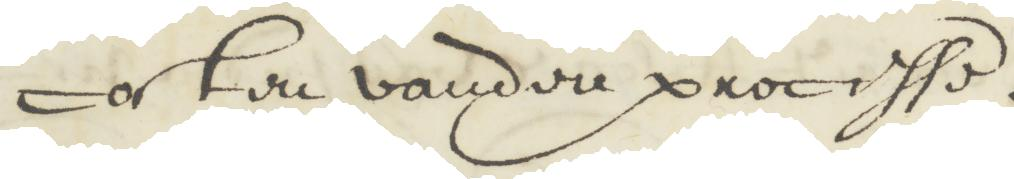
costen van den processe
